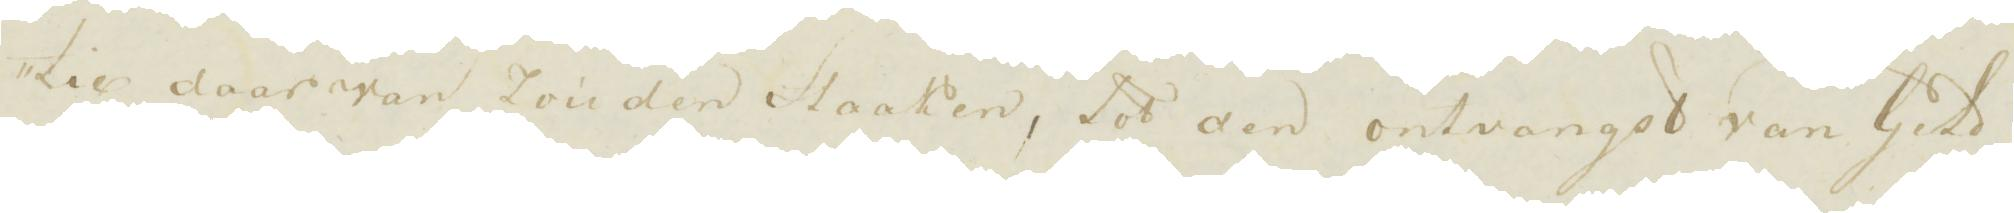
„tie daar van zouden staaken, soo den ontvangst van Geld
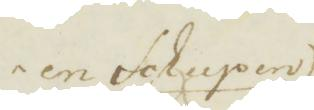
en scheepen
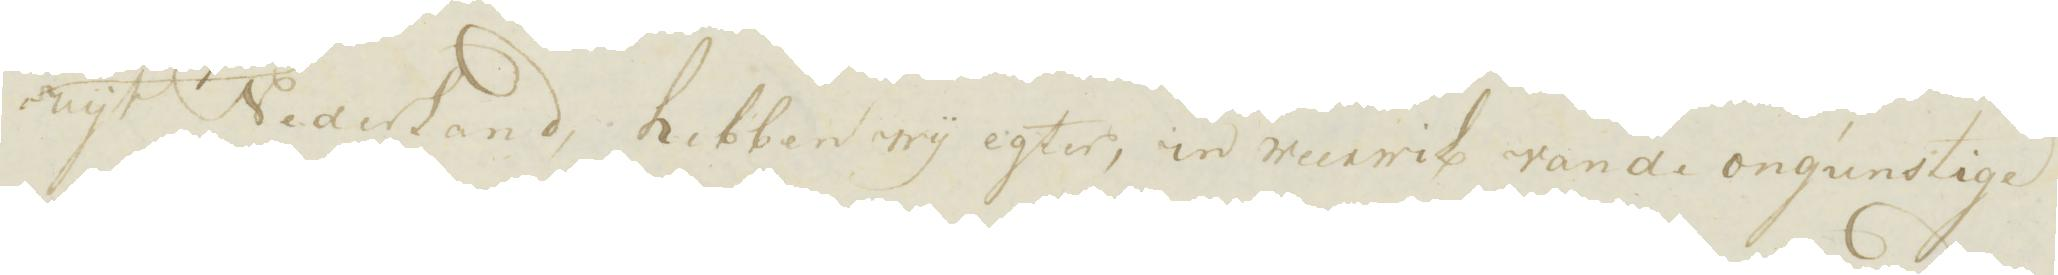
uijt Nederland, hebben wij egter, in weerwil van de ongunstige
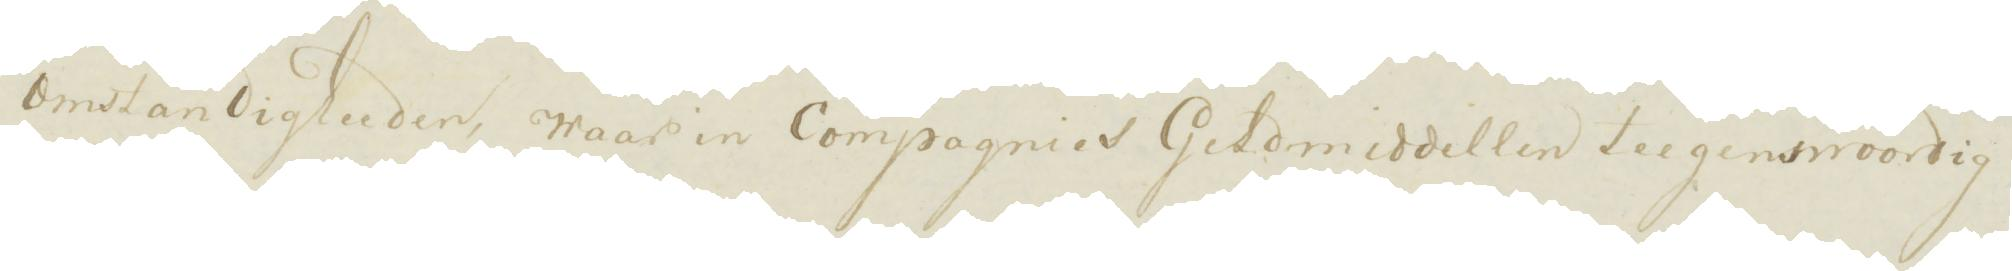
omstandigheeden, waar in Compagnies Geldmiddellen teegenswoordig
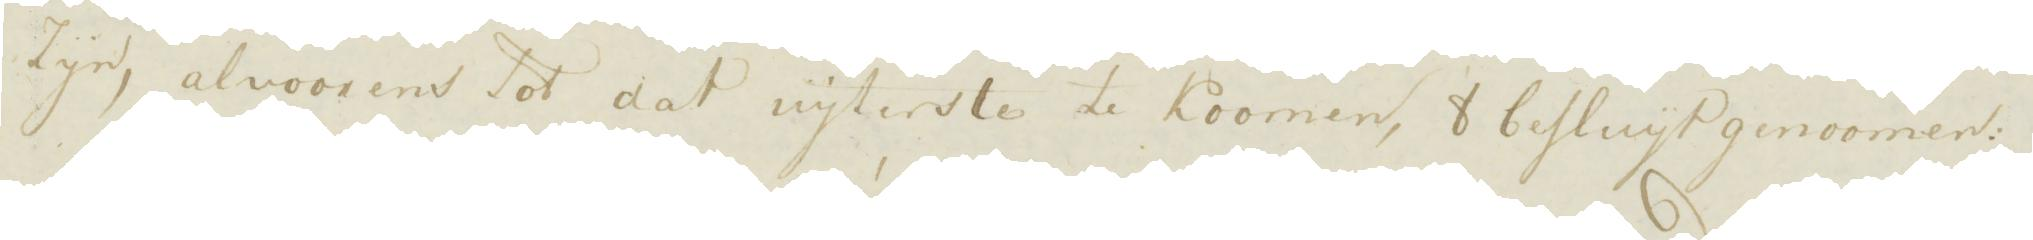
zijn, alvoorens tot dat uijterste te koomen, 't besluijt genoomen:
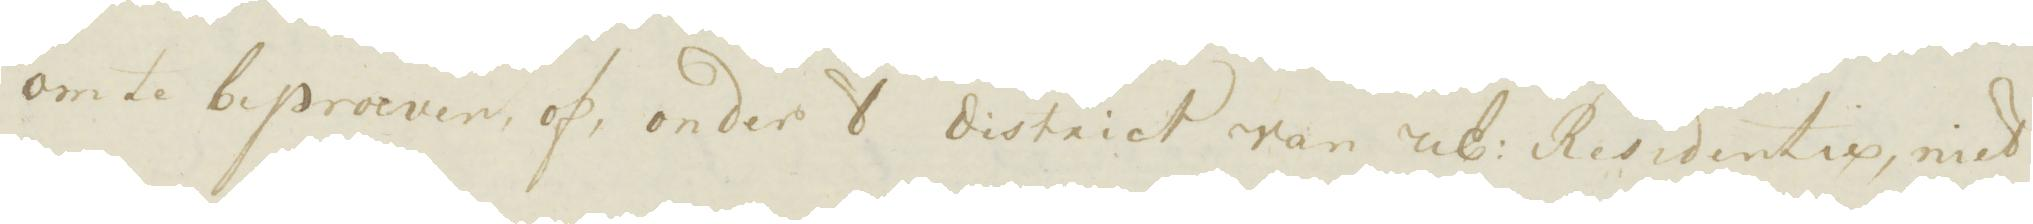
om te beproeven, of onder 't district van uE: Residentie, niet
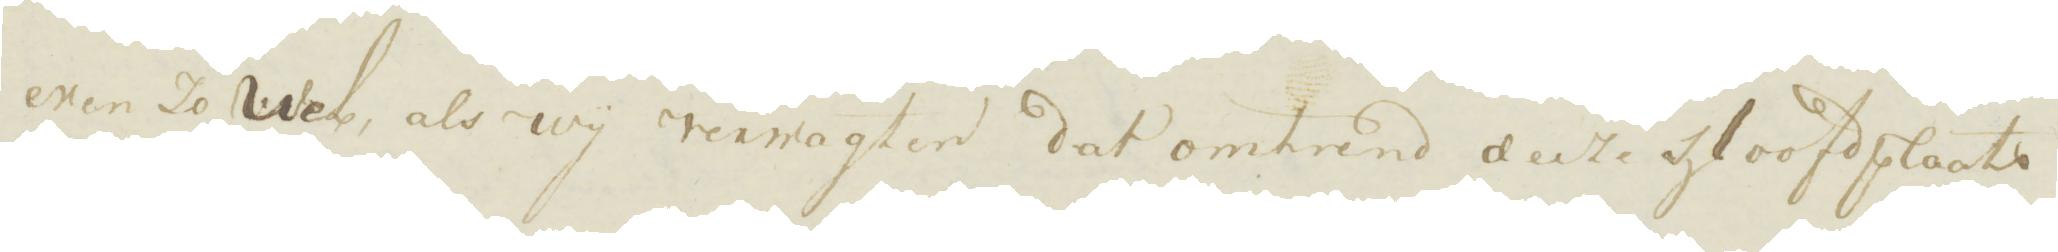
even zo wel, als wij vermogten dat omtrend deeze Hoofdplaats
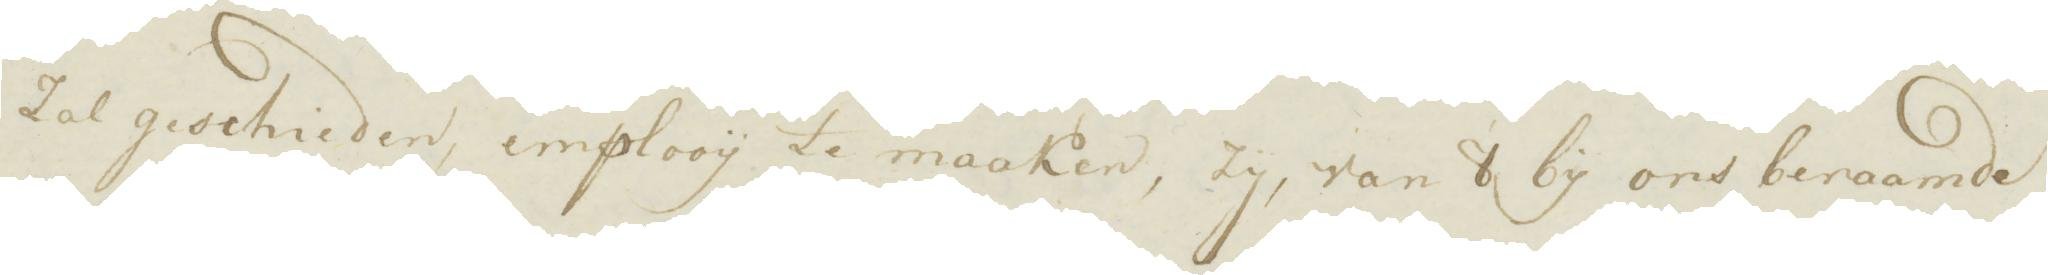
zal geschieden, emplooij te maaken, zij, van ’t bij ons beraamde
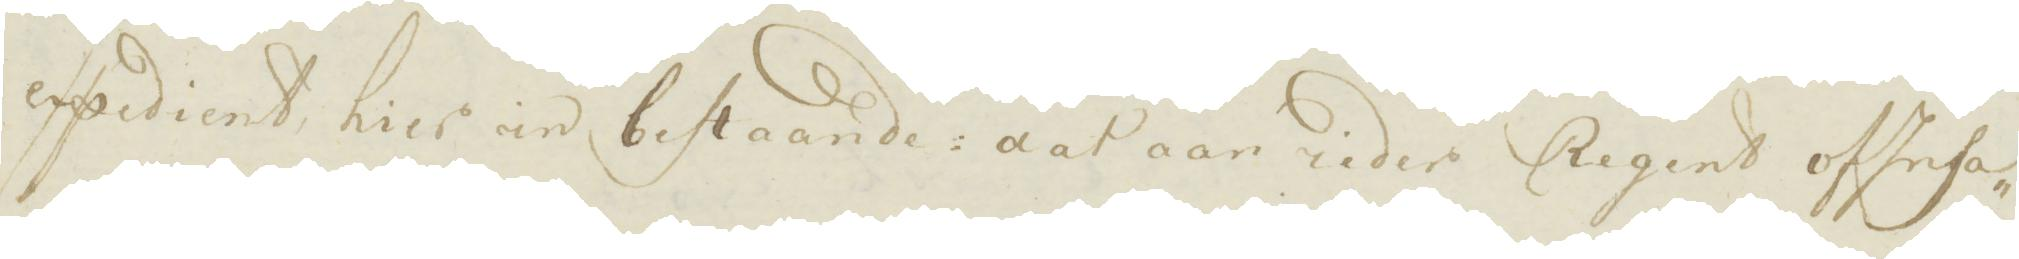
expedient hier in bestaande: dat aan ieder Regent of jnsa„
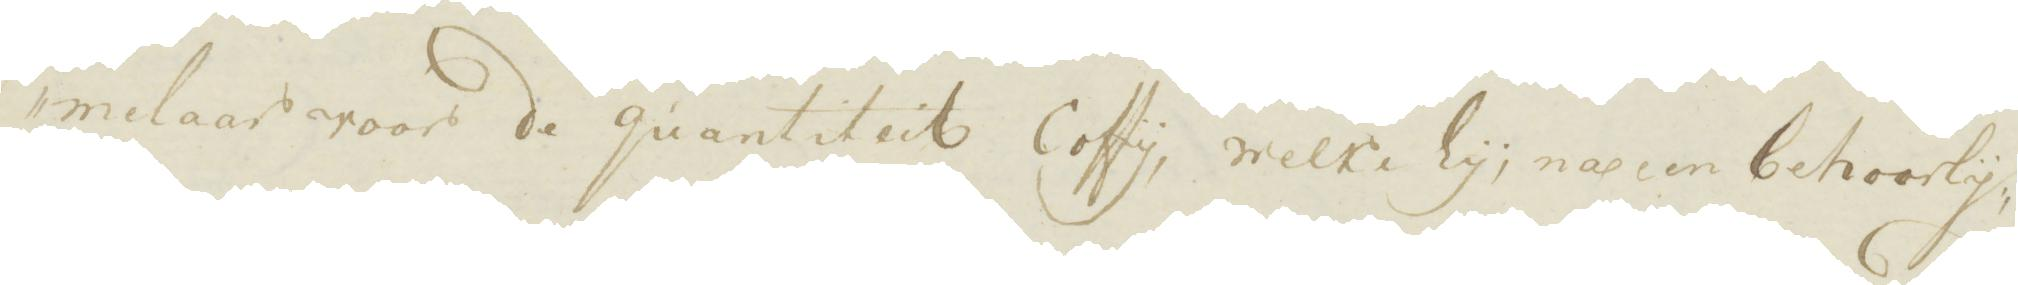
„melaar voor de quantiteit Coffij, welke hij, na een behoorlij„
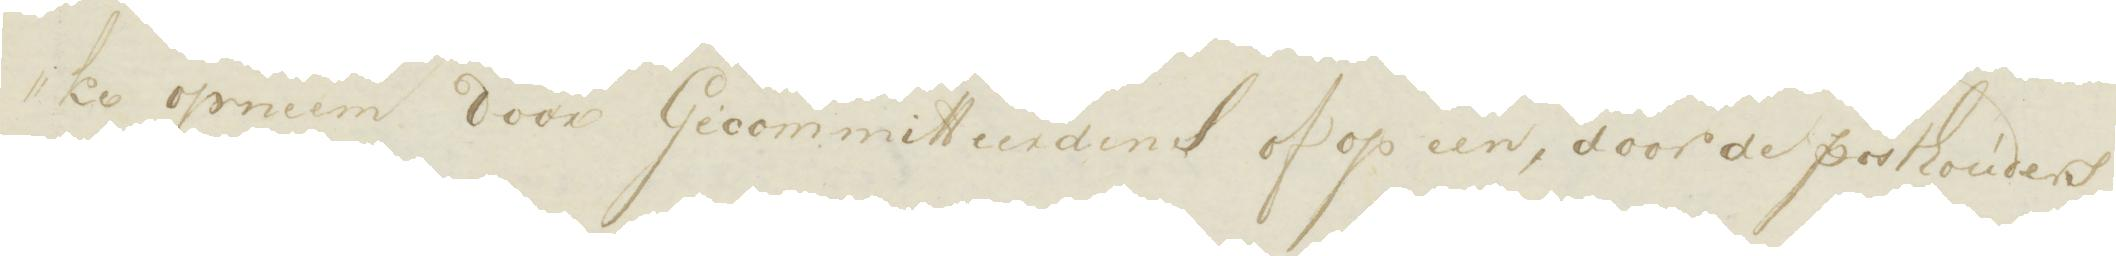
ke opneem door Gecommitteerdens of op een, door de posthouders
